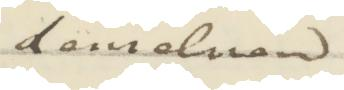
dencelven
